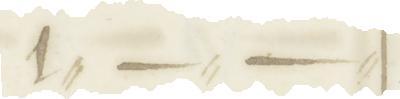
1„ —„ —„
